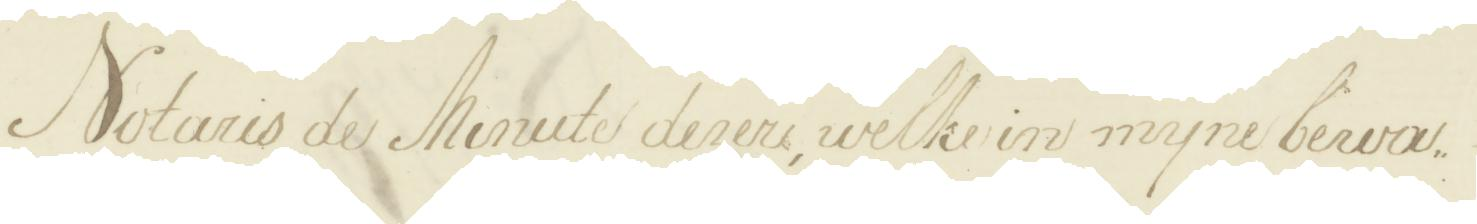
Notaris de Minute dezer, welke in myne bewa„
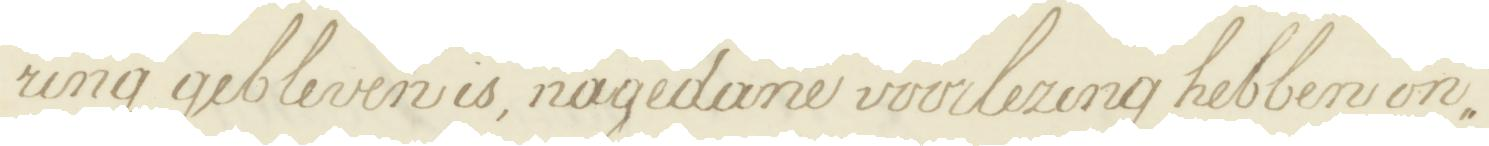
ring gebleven is, nagedane voorlezing hebben on„
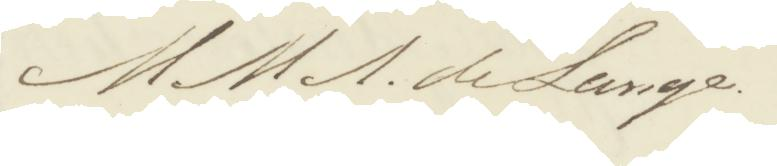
M M A. de Lange.
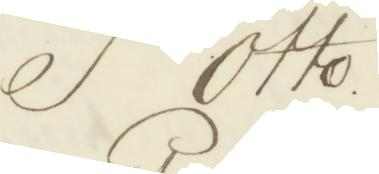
I Otto.
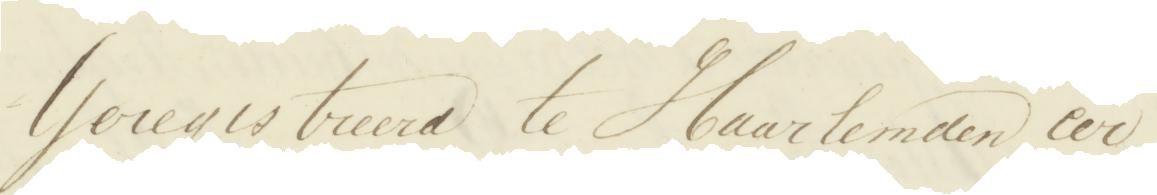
Geregistreerd te Haarlem den eer
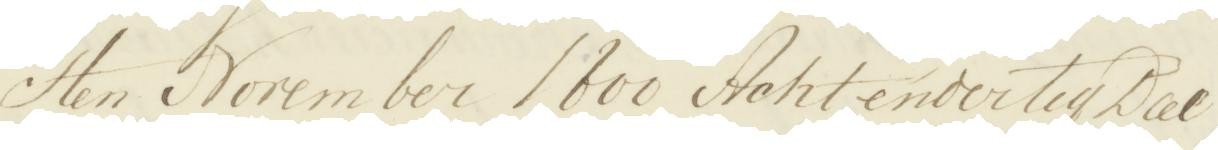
sten November 1800 Acht endertig Deel
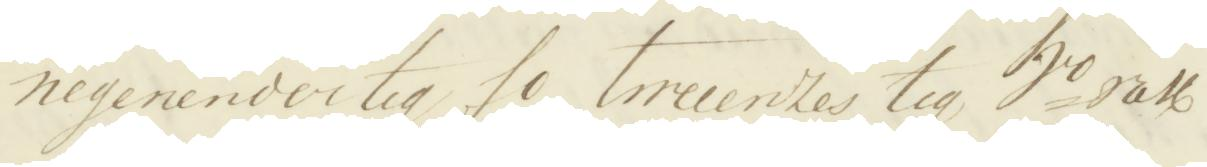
negenendertig, f=o tweeenzestig V=o vak
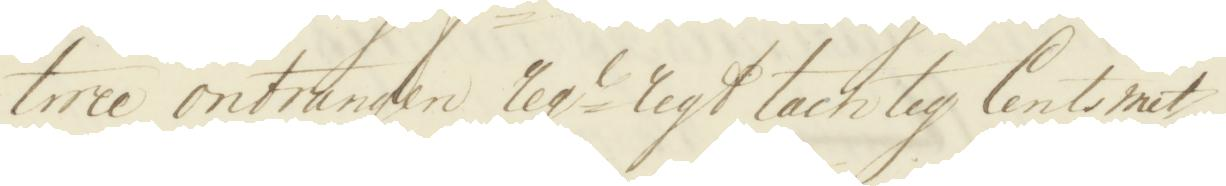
twee ontvangen reg=e regt tachtig Cents met
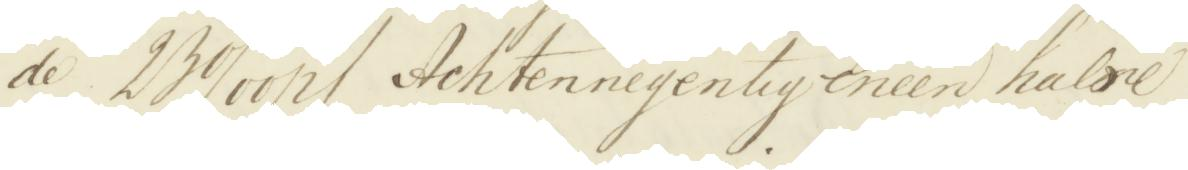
de 23%opC Achtennegentig eneen halve
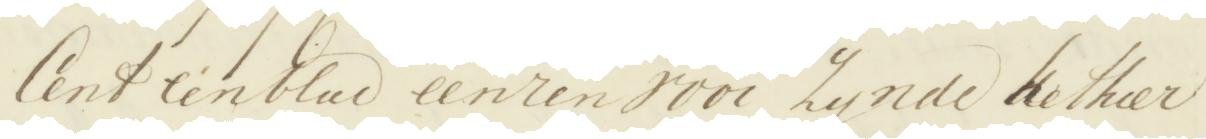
Cent eenblad eenrenvooi Zynde het hier
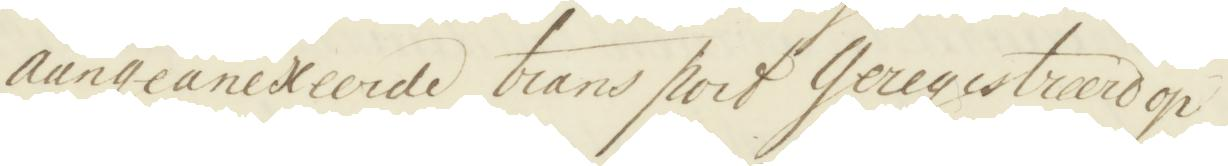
aangeanexeerde transport Geregistreerd op
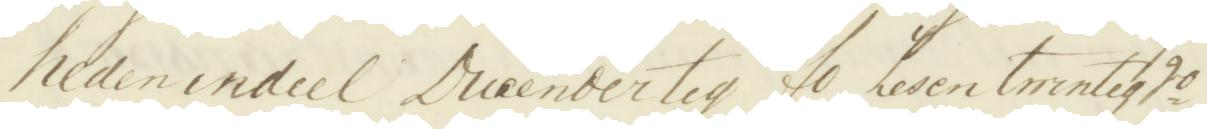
heden indeel Drieendertig f=o Zesen twintig V=o
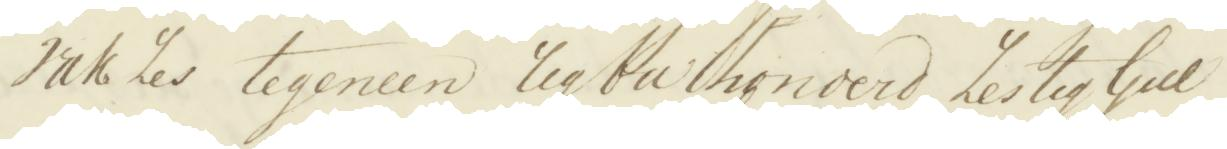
Vak Zes tegeneen regt a honderd Zestig Gul
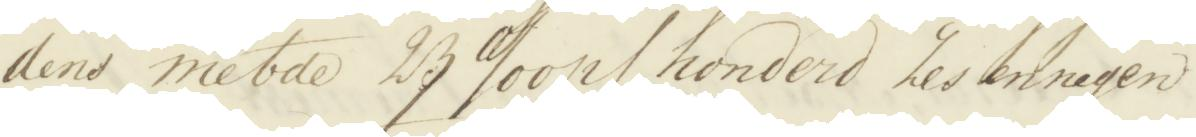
dens metde 23%opC honderd Zes ennegen
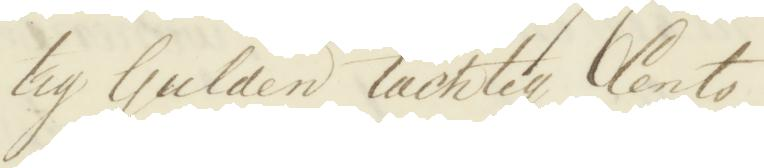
tig Gulden tachtig Cents
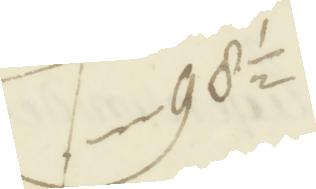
ƒ —98½
